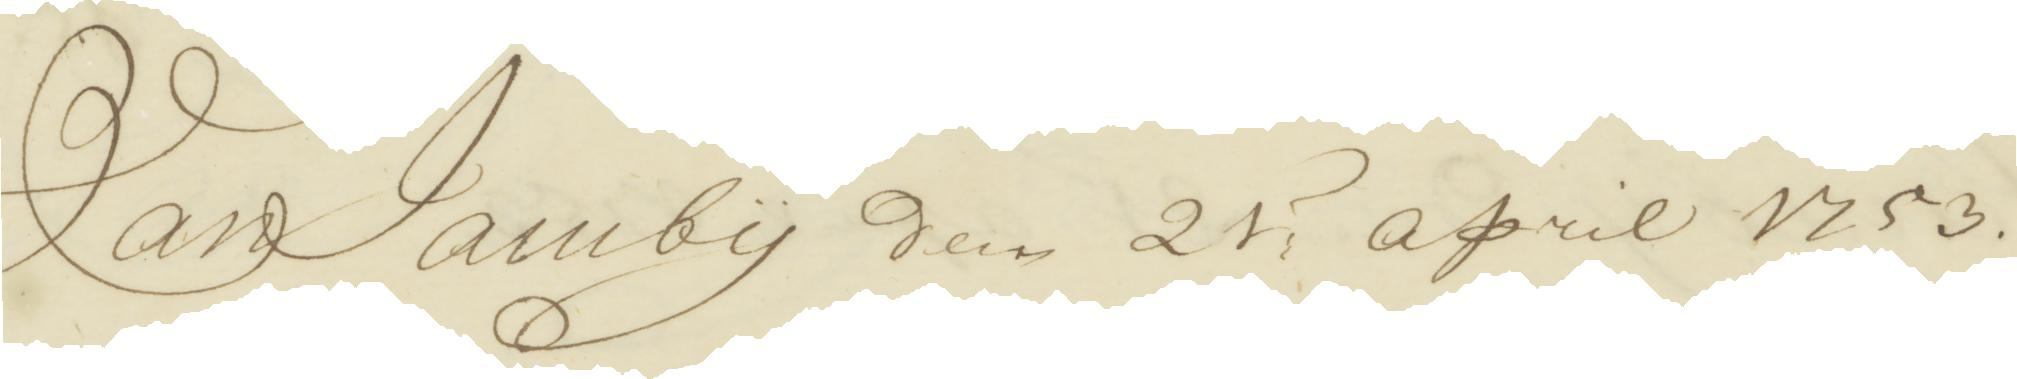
Van Jambij den 21:' april 1753.
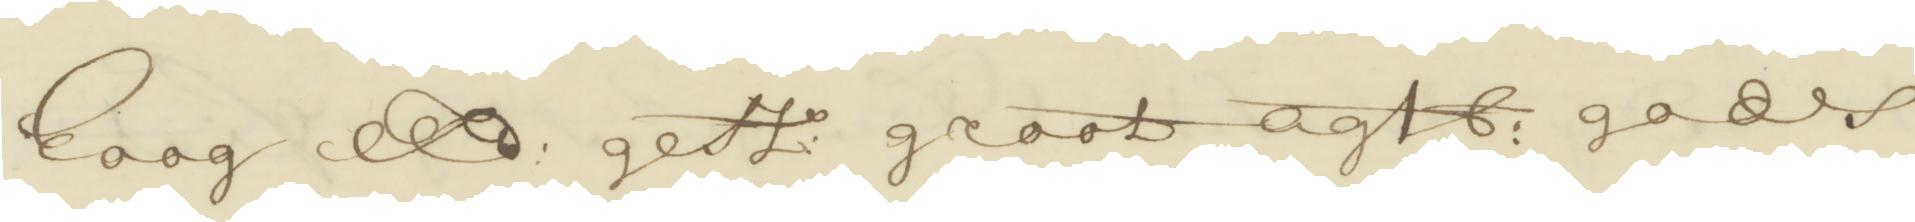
hoog Ed: gest: groot agtb: godes
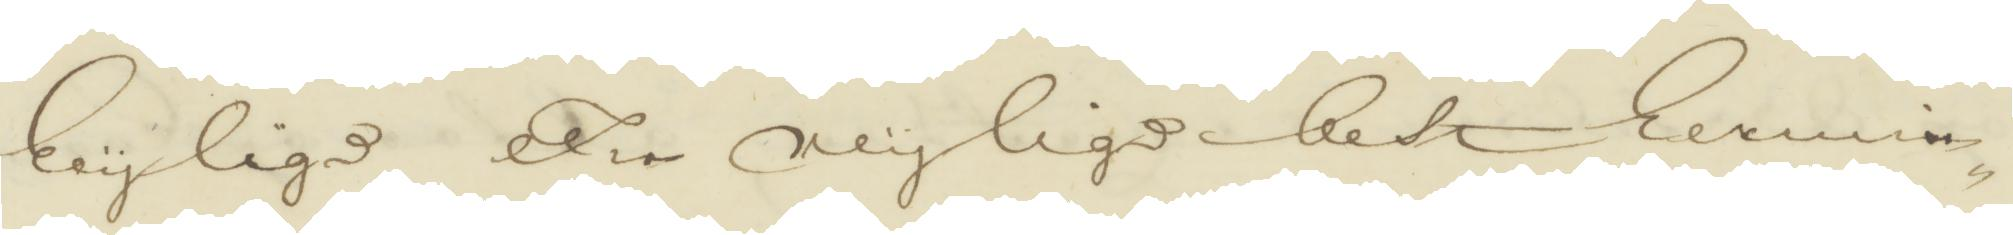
heijlige, Een veijlige beschermin„
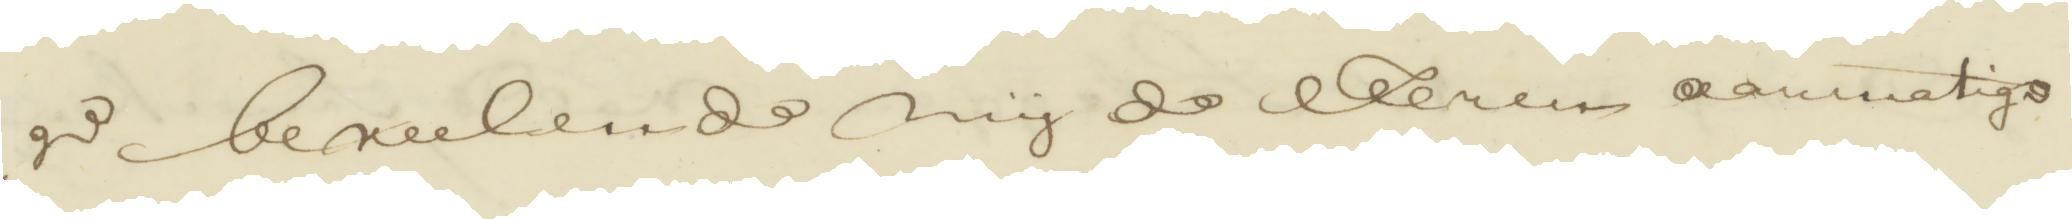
ge beveelende mij de eeren aanmatige
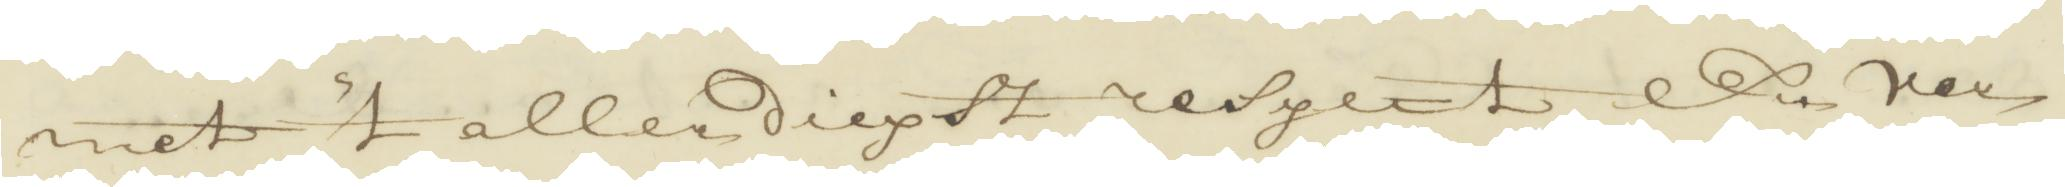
met ’t allerdiepst respect, en ver
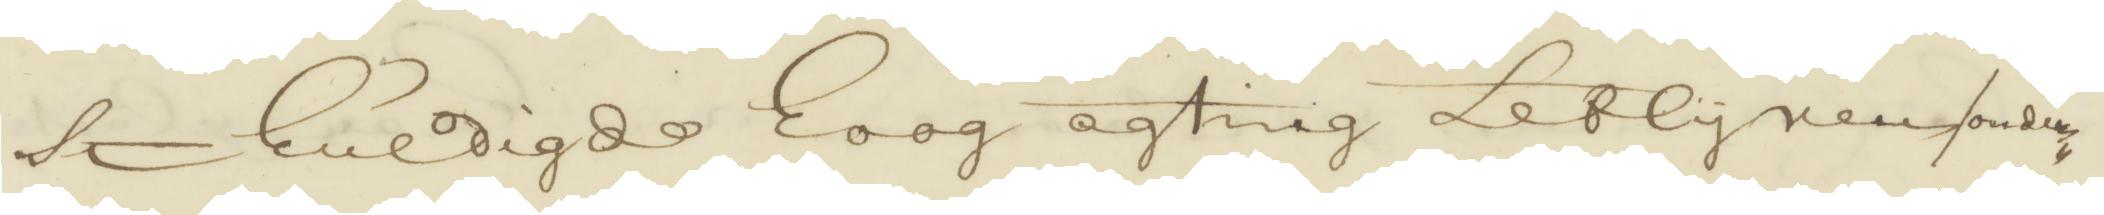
schuldigde hoog agting teblijven / onder„
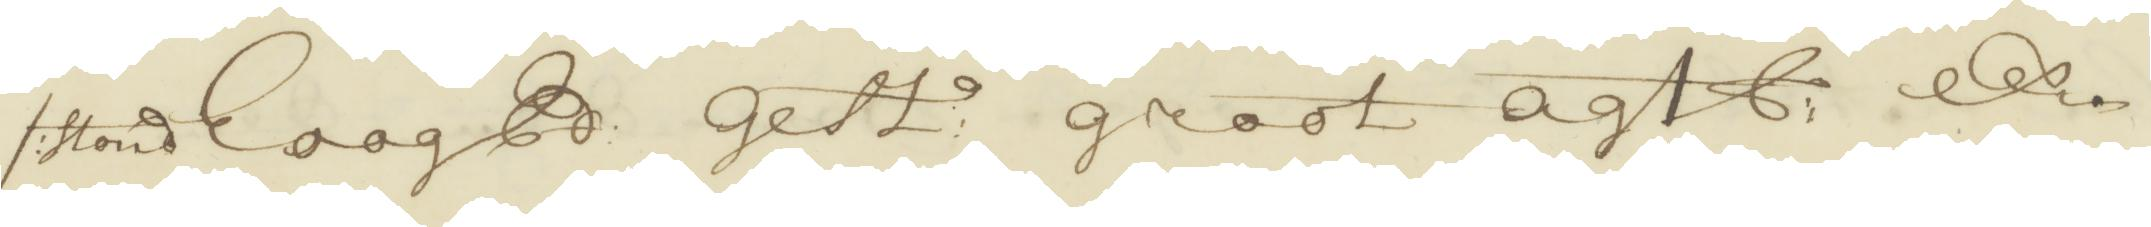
/: stond hoog Ed: gest: groot agtb: een
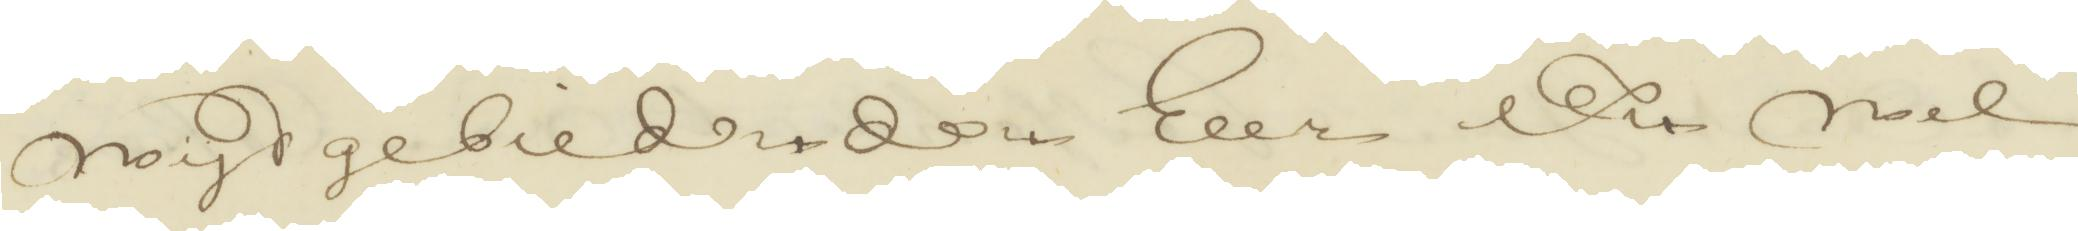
wijd gebieden den heer En wel
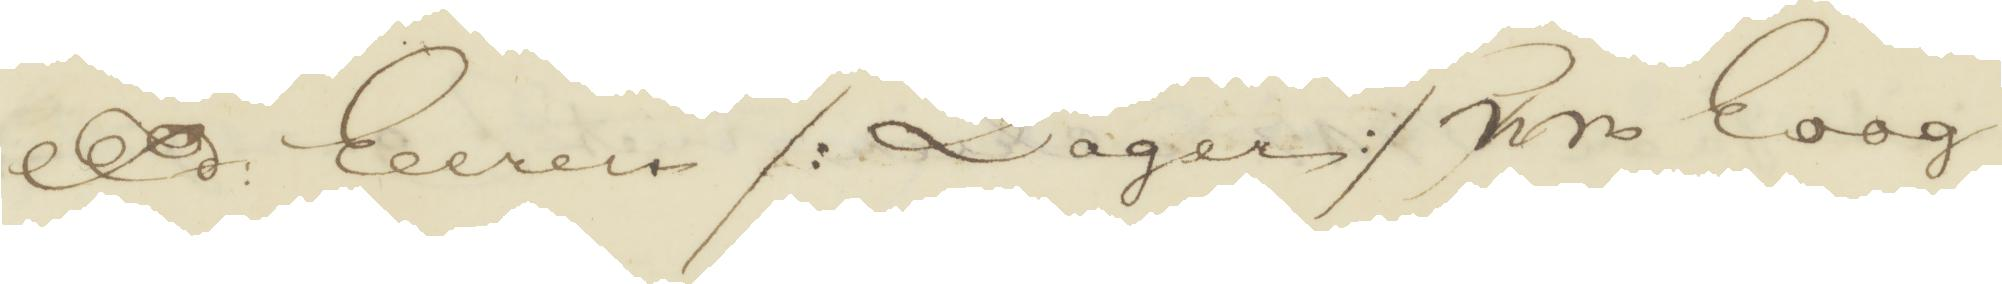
Ed: Heeren /:Lager:/ uw hoog
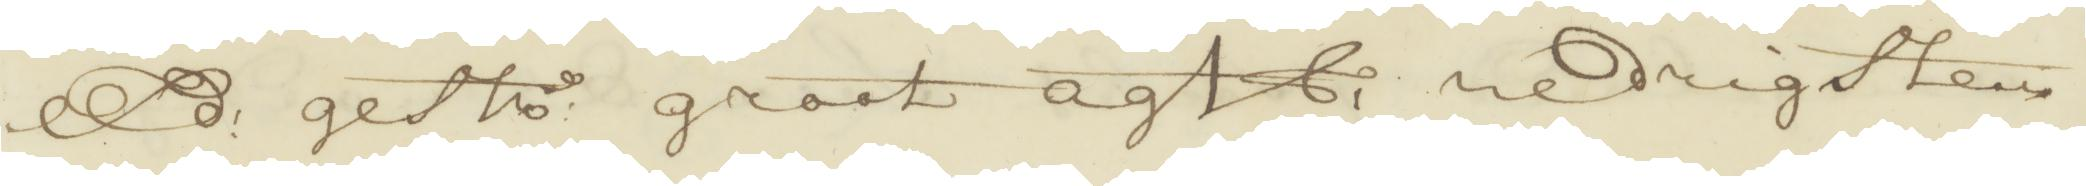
Ed: gest:e groot agtb. nedrigsten
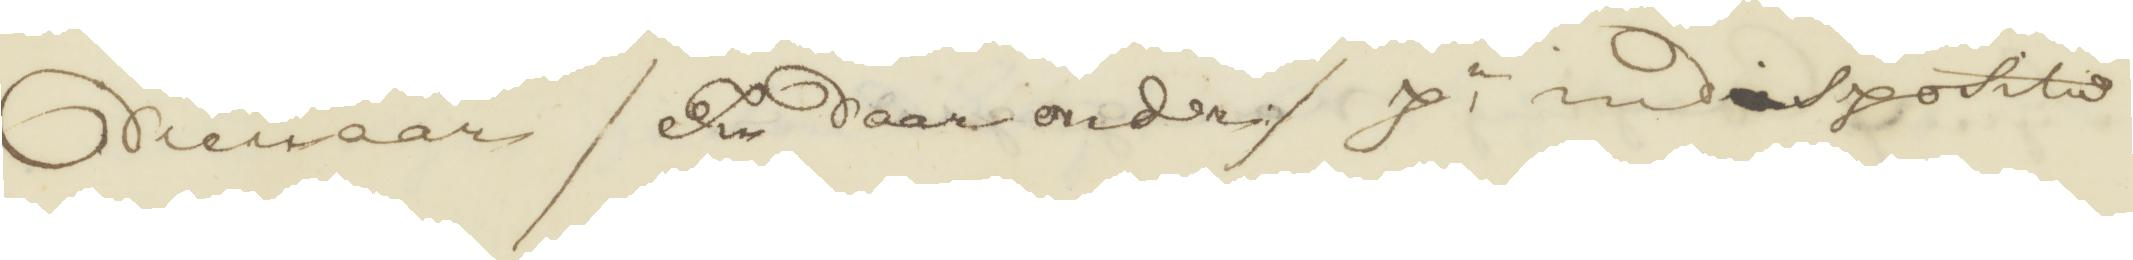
dienaar / En daar onder:/ p.n indispositie
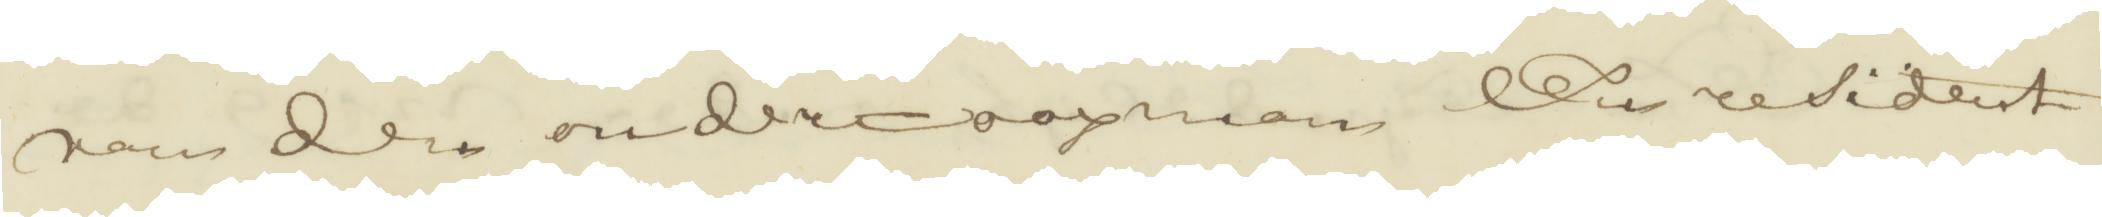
van den ondercoopman En resident
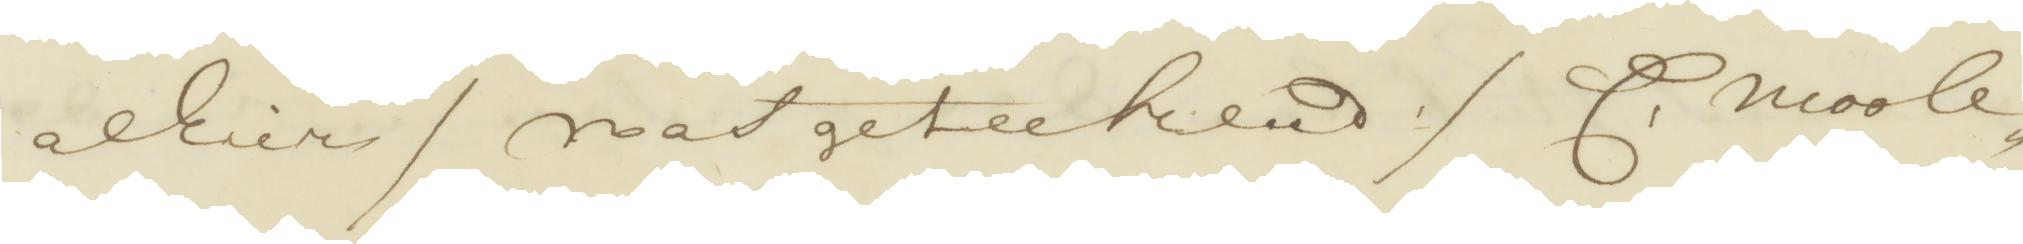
alhier / was geteekend ./ C. moole„
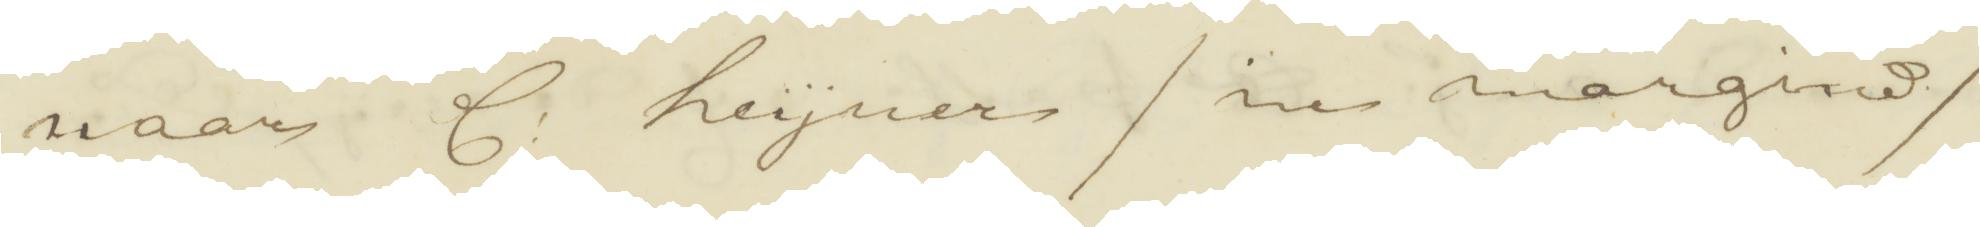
naar C: heijners / in margine/
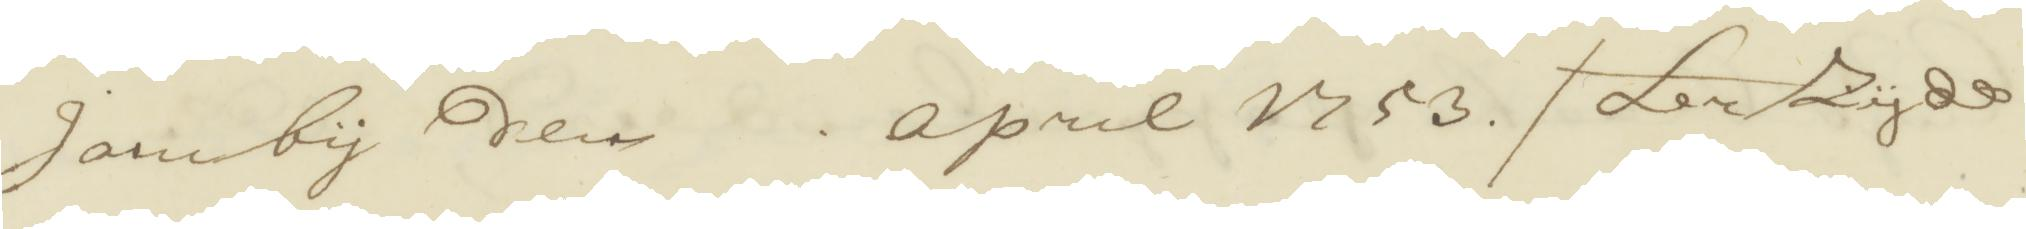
Jambij den . april 1753. / ter zijde
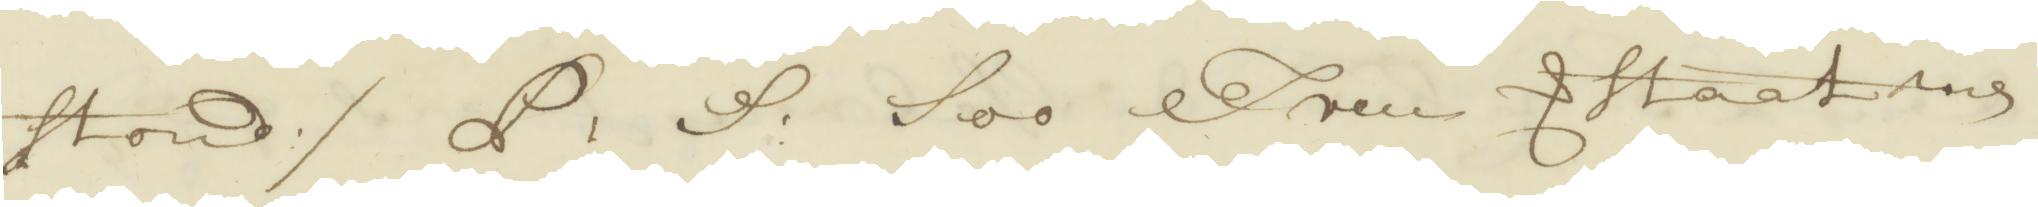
stond:/ P: S: Soo Even verstaat men
